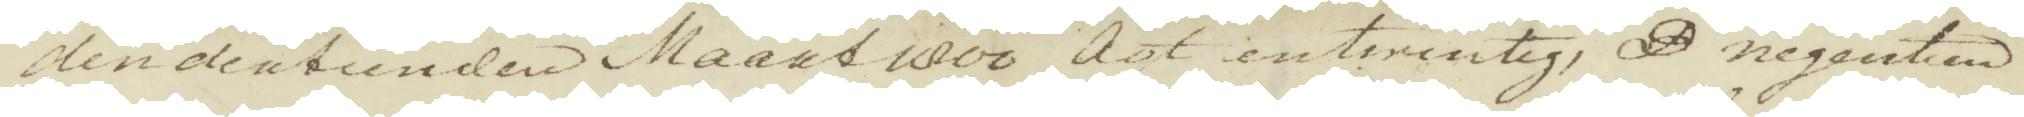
den dertienden Maart 1800 Agt en twintig, D negentien
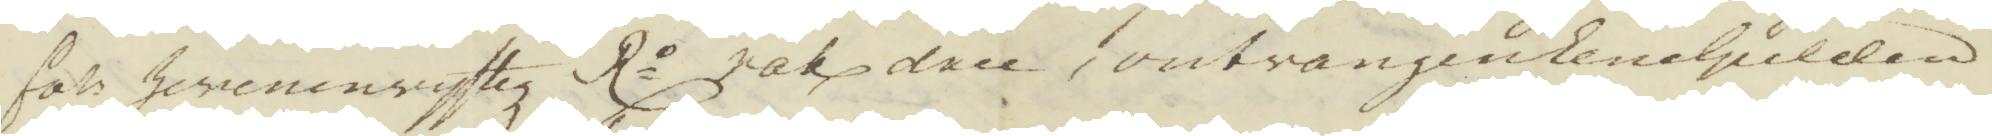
fols zevenenvyftig R=o vak drie, ontvangen Eene Gulden
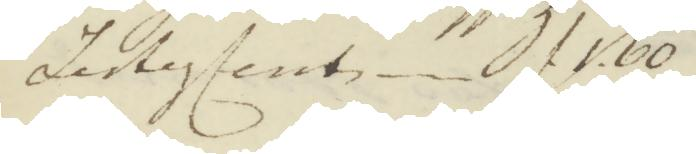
Zestig Cents_ _ ƒ 1.60
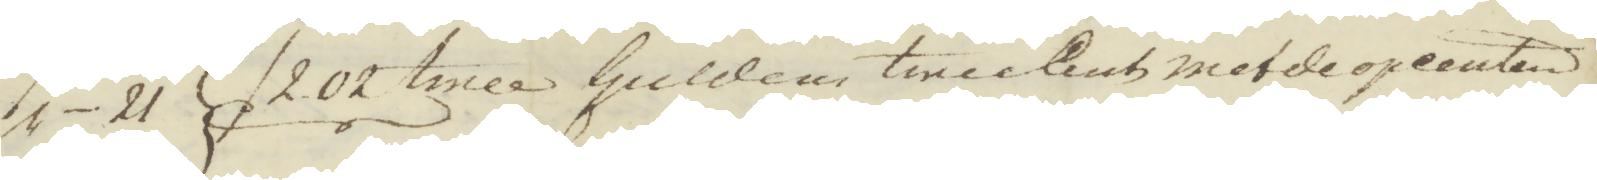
— 21 ƒ2.02 twee Guldens twee Cents met de op centen
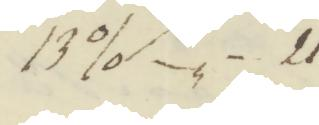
13% — „ — 21
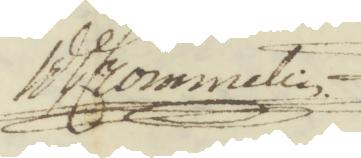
W E Crommelin.
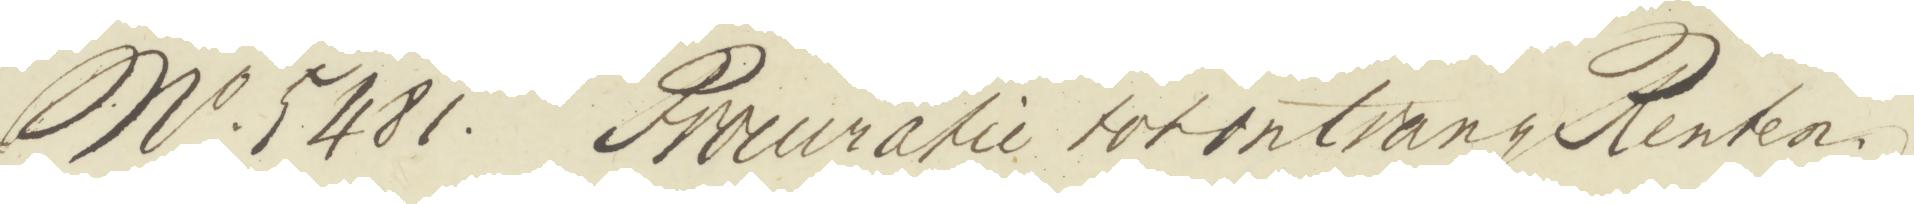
N.o 5481. Procuratie tot ontvang Renten.
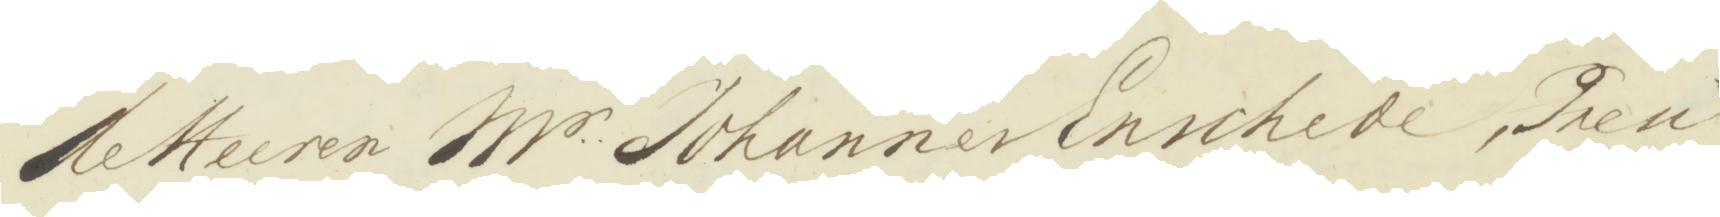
de Heeren M.r Johannes Enschedé, Presi
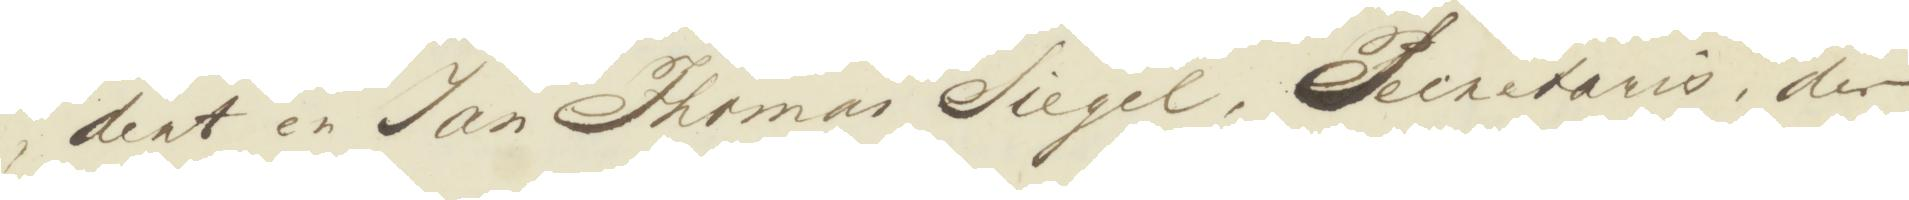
,dent en Jan Thomas Siegel, Secretaris, der
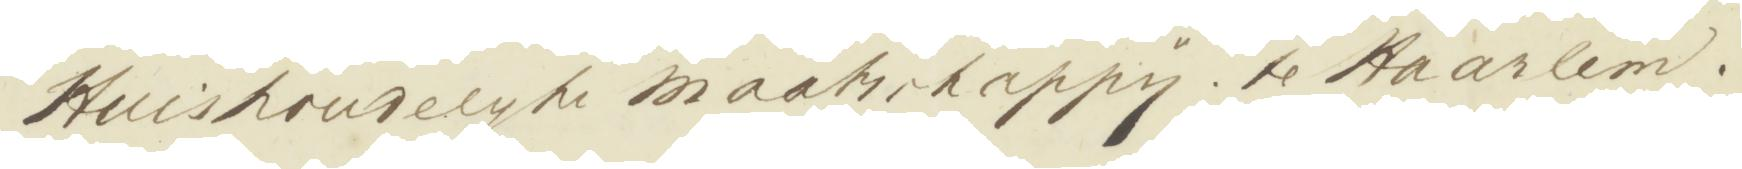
Huishoudelyke maatschappij. te Haarlem.
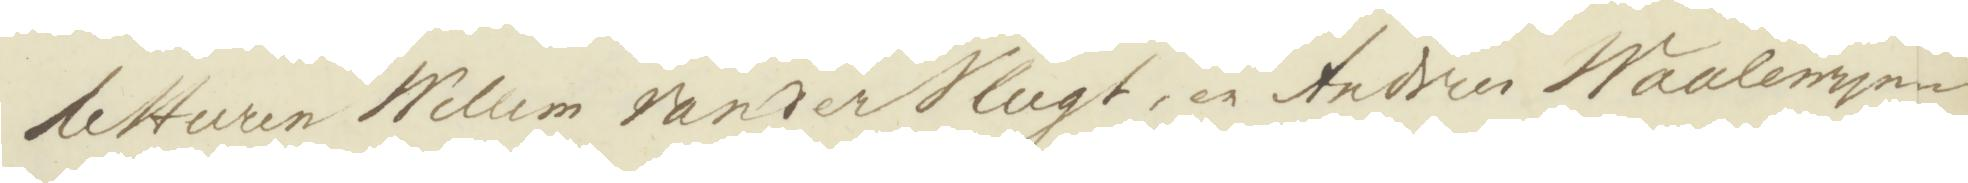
de Heeren Willem van der Vlugt, en Andries Waalewyn
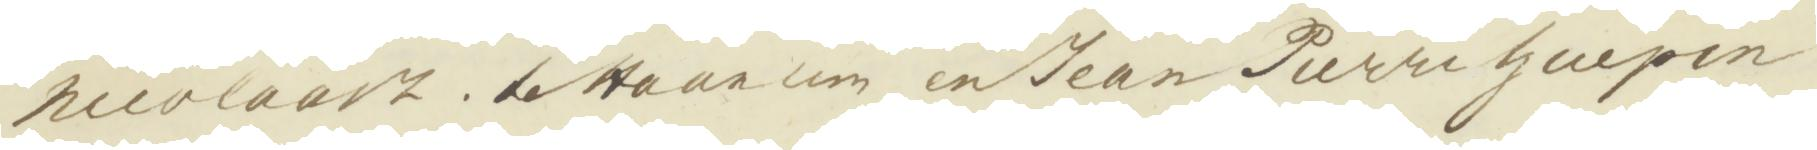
nicolaasz. te Haarlem en Jean Pierre Guepen
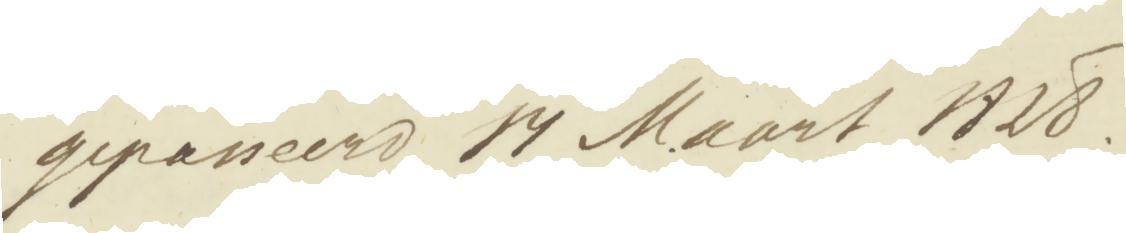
gepasseerd 14 Maart 1828.
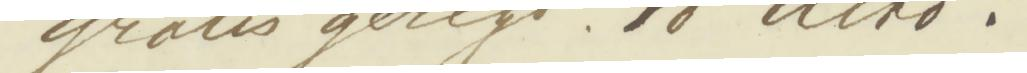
gratis gezegd 18 dito.
